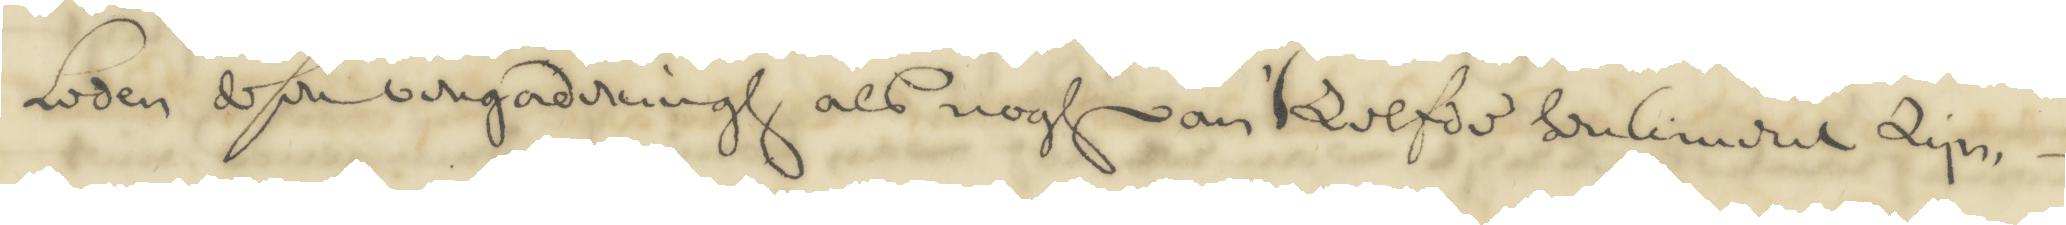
leden desen vergaderingh, als nogh van 't Zelfde sentiment Zijn,
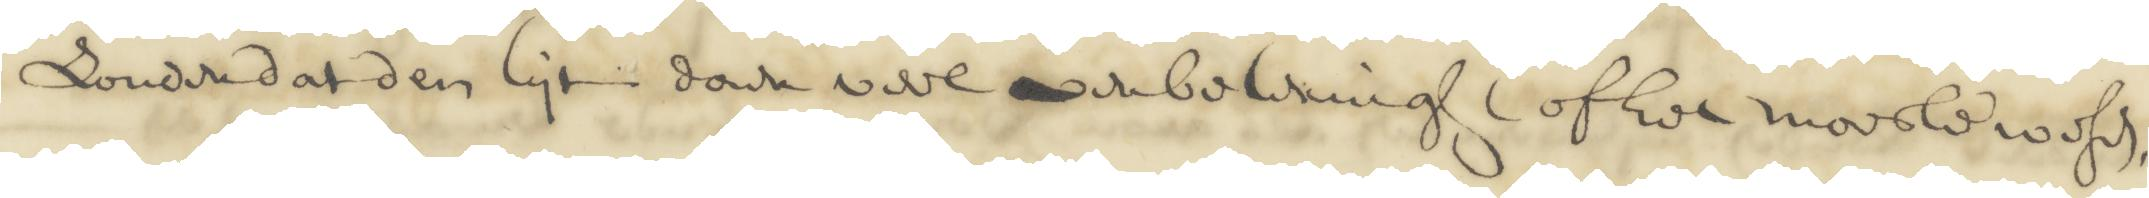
Zonder dat den tijt daer veel verbeteringh ( of het moeste wesen,
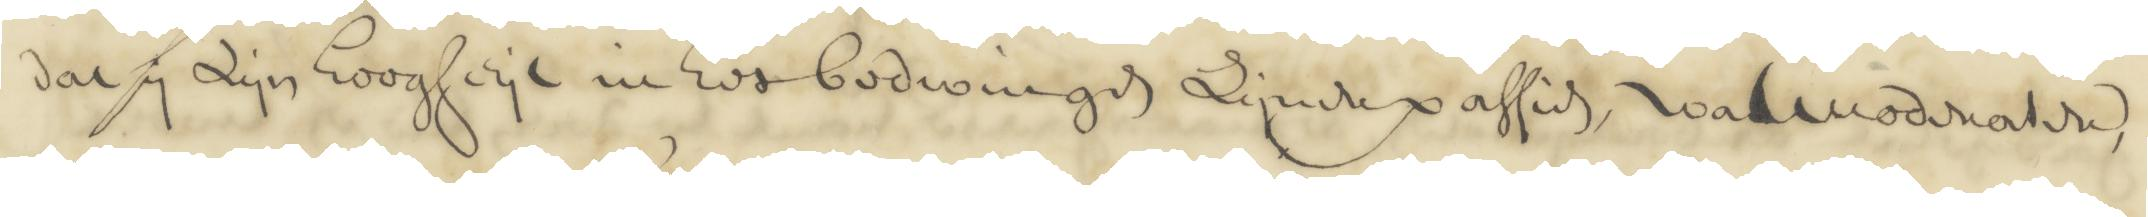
dat sij Zijn hoogheijt in het bedwingen Zijner passien, wat moderater,
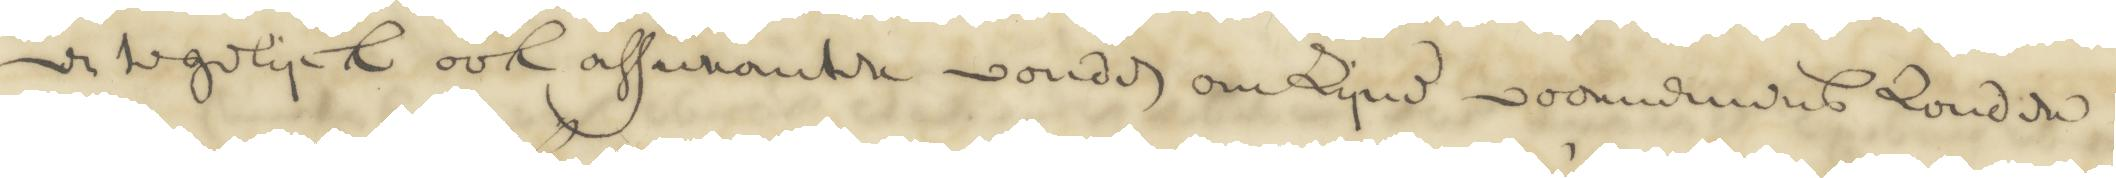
en te gelijck ook assuranter vonden om Zijne voornemens Zonder
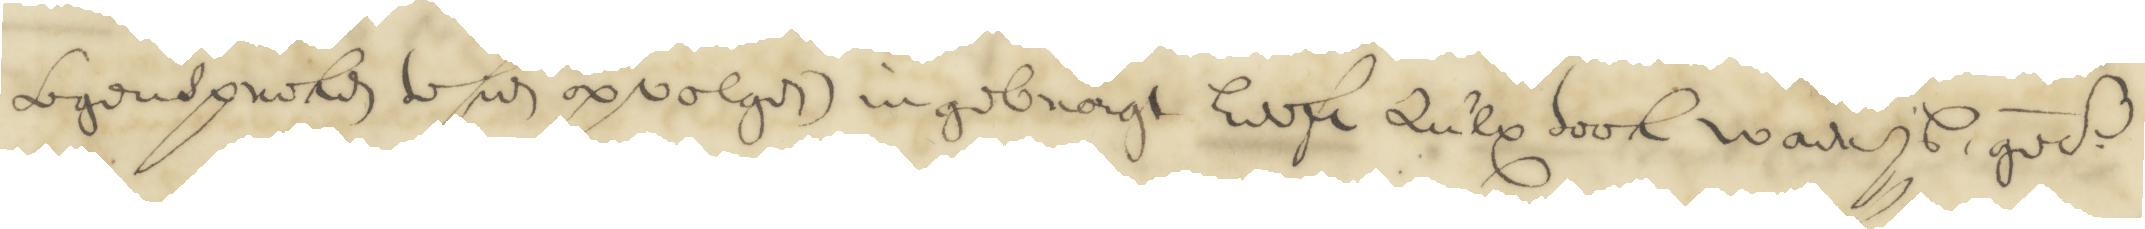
tegenspreken te sien opvolgen) ingebragt heeft zulx 't ook waer js, gelijk
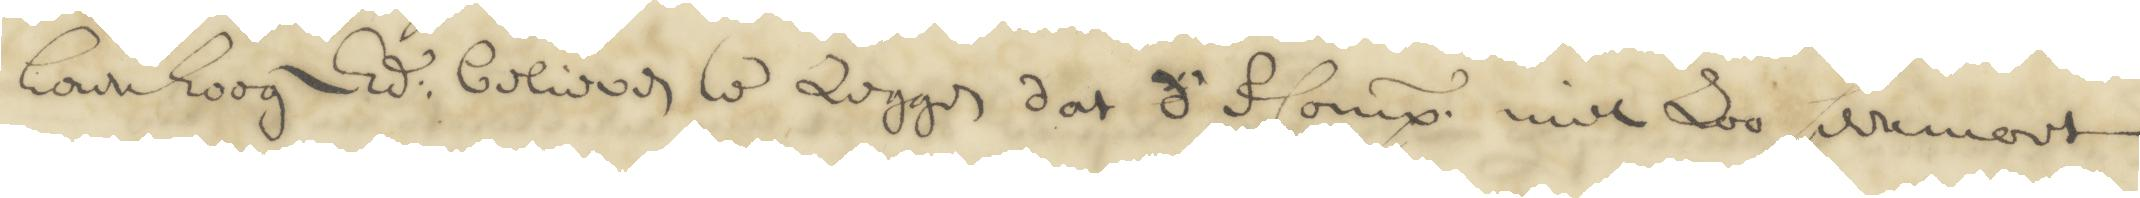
haer hoog Ed: believen te zeggen dat d’ E Comp. niet Zoo seer moet
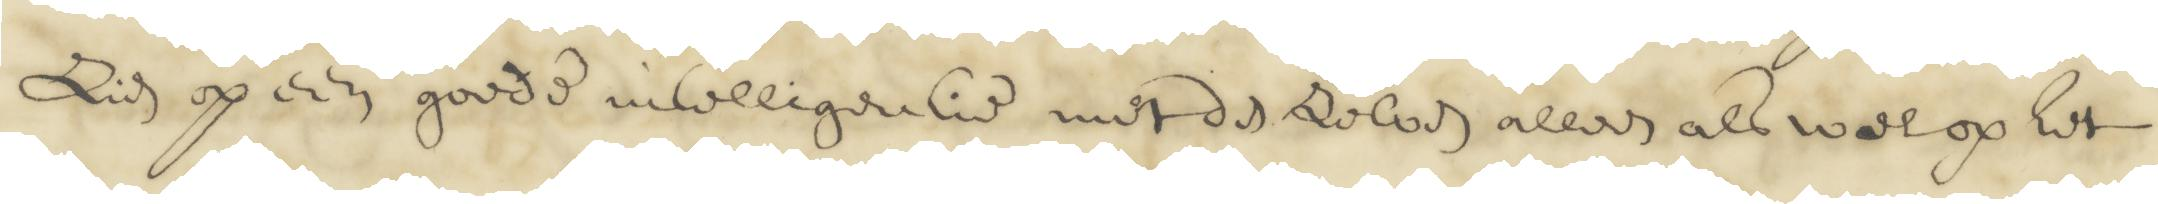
Zien op een goede intelligentie met den Zelven alleen als wel op het
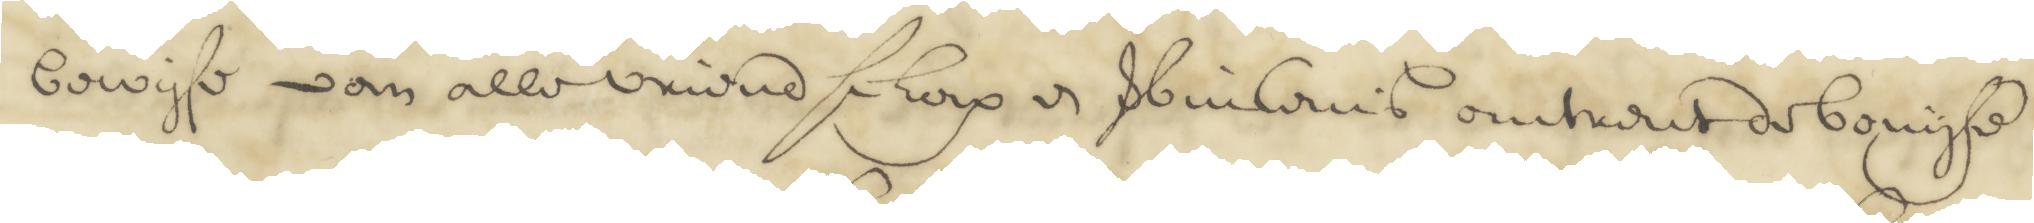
bewijse van alle vriend schap en verbintenis omtrent de bonijse
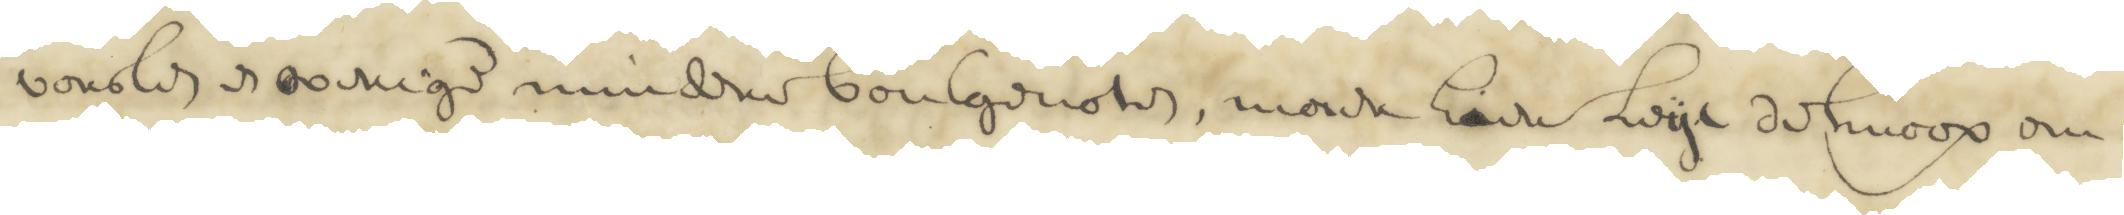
vorsten en overige mindere bontgenoten, maer hier Leijt de knoop om
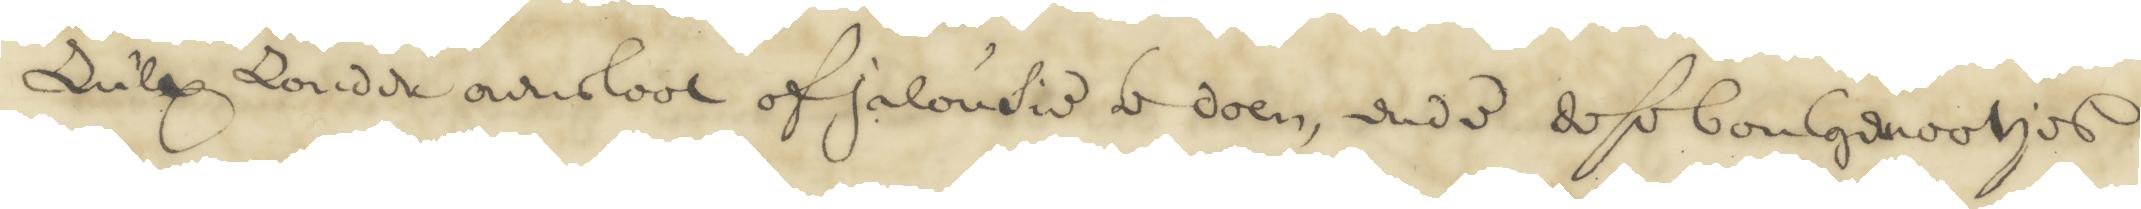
Zulx Zonder aenstoot of jalousie te doen, ende dese bontgenootjes
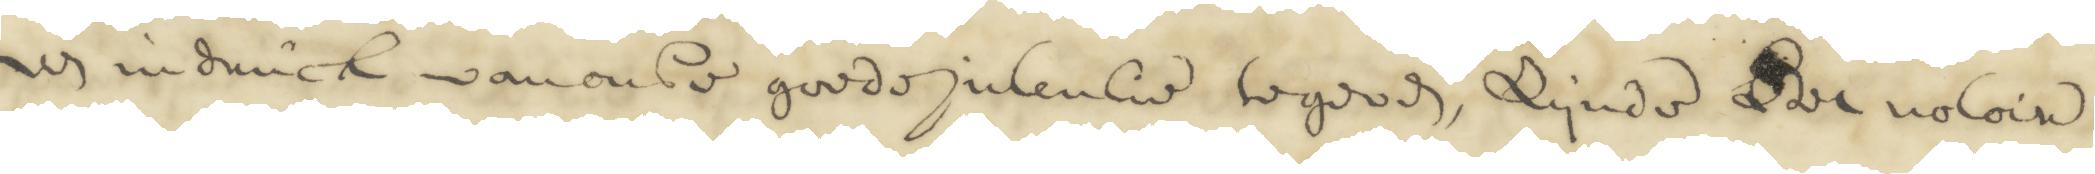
een indruck van onse goede jntentie tegeven, Zijnde Het notoir
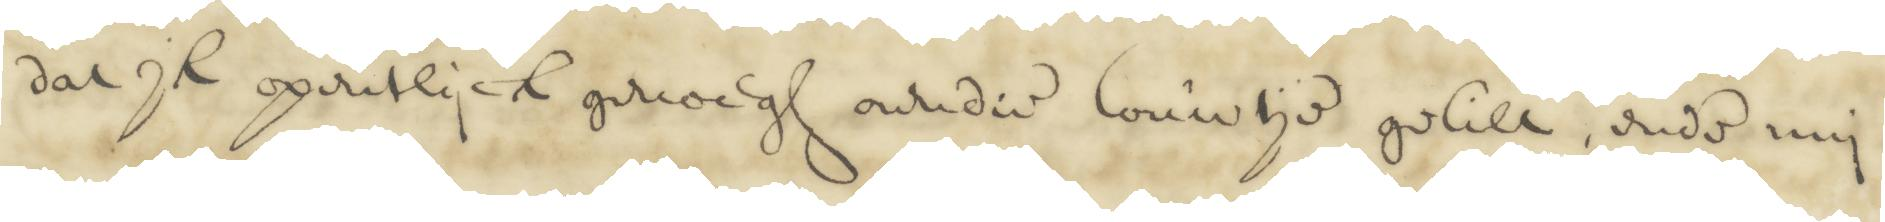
dat jk opentlijck genoegh aen die touwtje getilt, ende mij
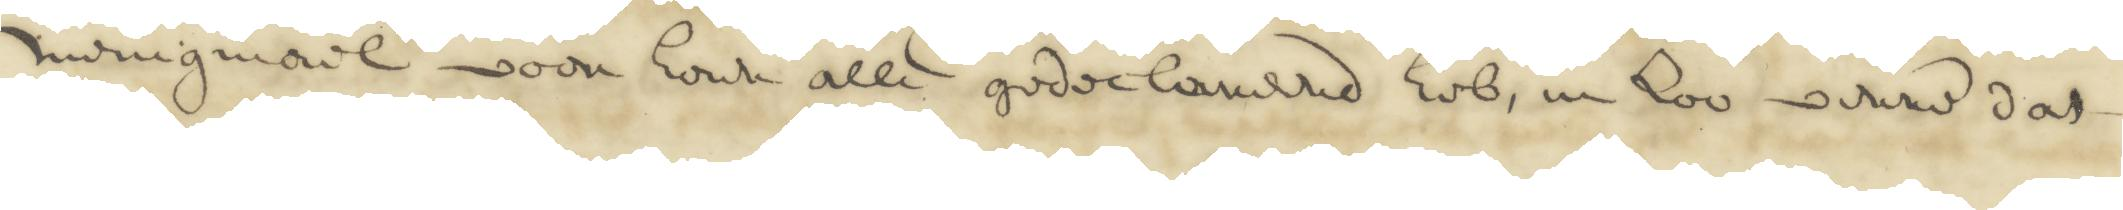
menigmael voor haer alle gedeclareerd heb, in zoo verre dat
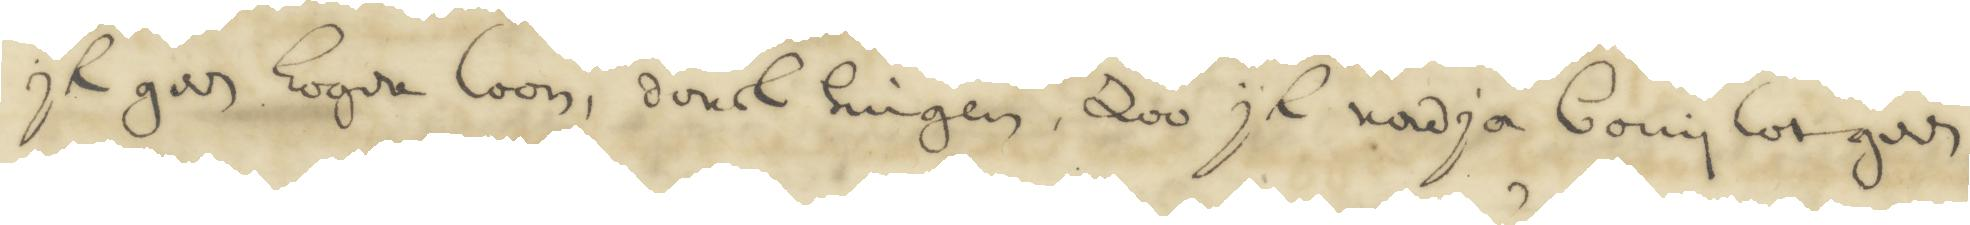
jk geen hoger toon, dorst singen, Zoo jk radja bonij tot geen
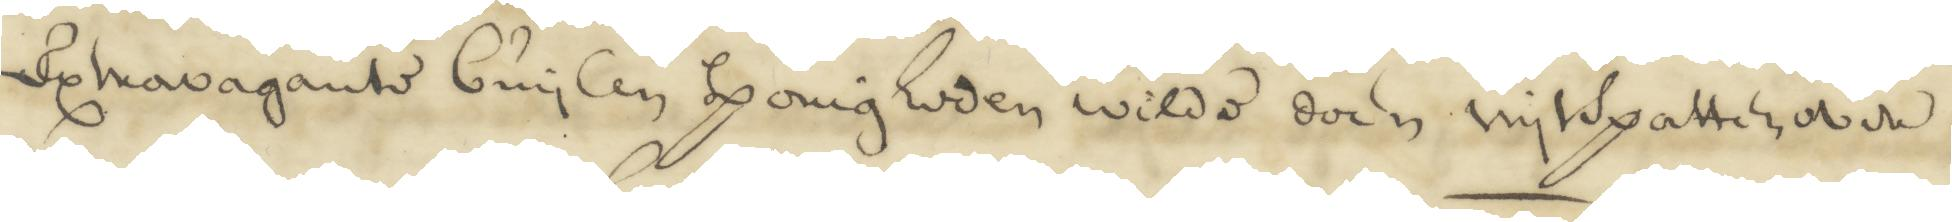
Extravagante buijten sporigheden wilde doen uijtspatten over
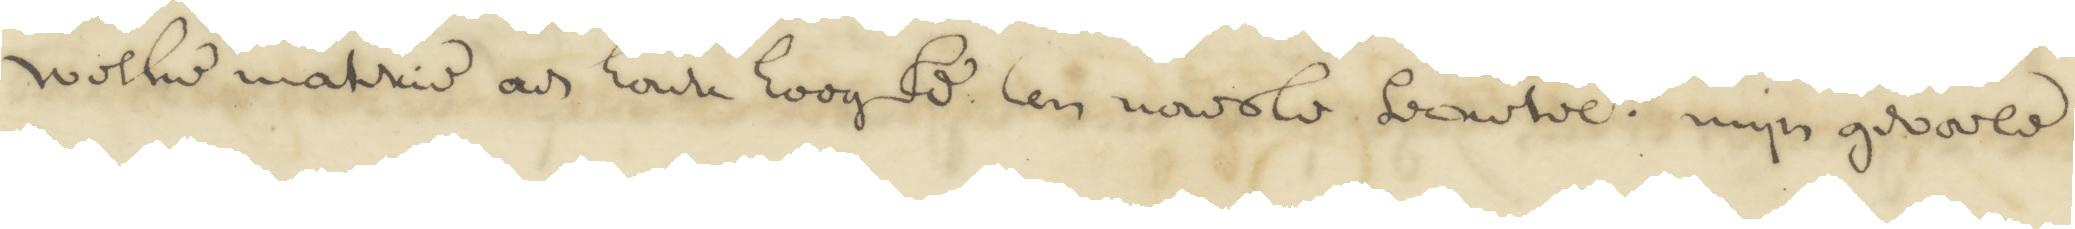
welke materie aen haer hoog Ed: ten naeste Secretelijk mijn gevoele
